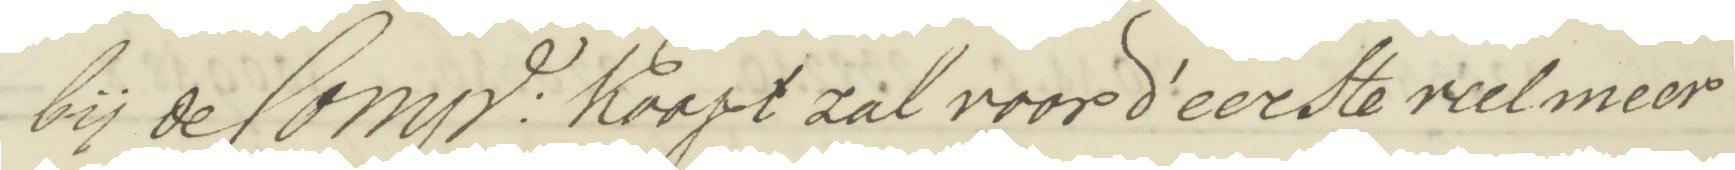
bij de Comp:e Koopt zal voor d’eerste veel meer
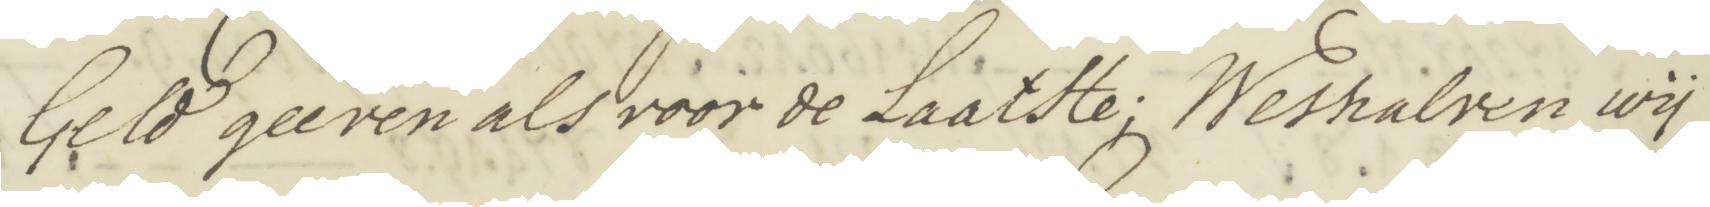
Geld geeven als voor de Laatste; Weshalven wij
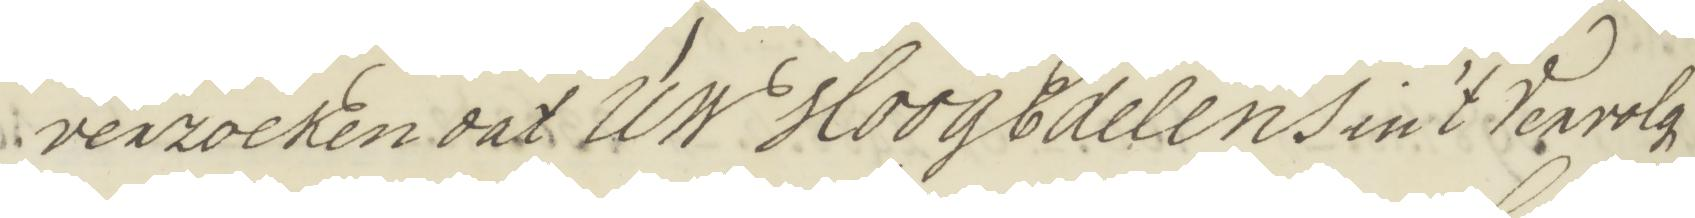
verzoeken dat UW Hoog Edelens in 't Vervolg
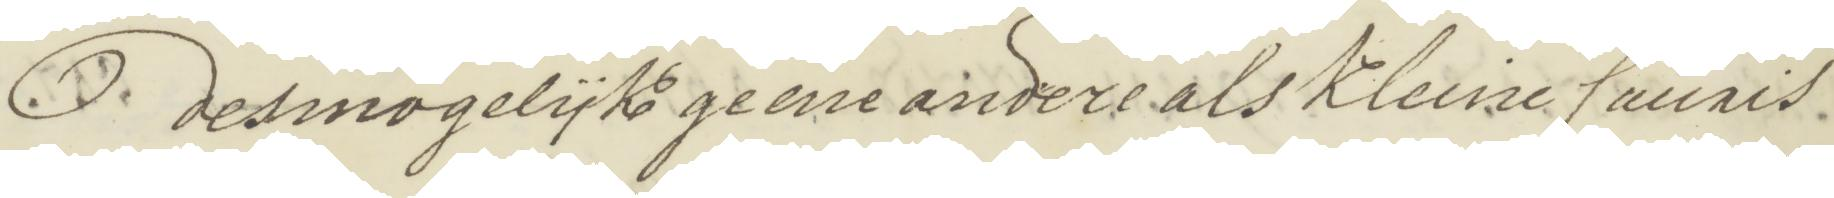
desmogelijk geene andere als Kleine Cauris
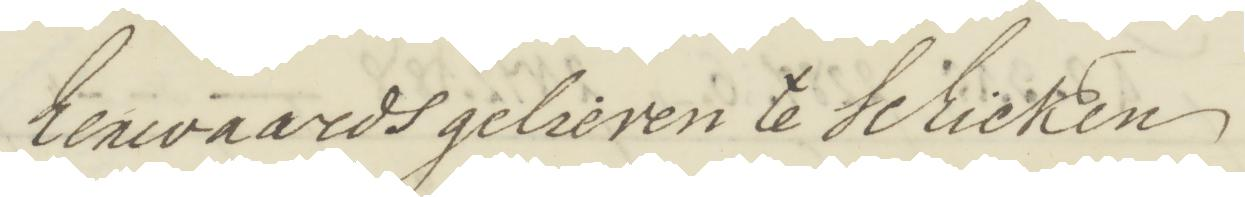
herwaards gelieven te Schicken
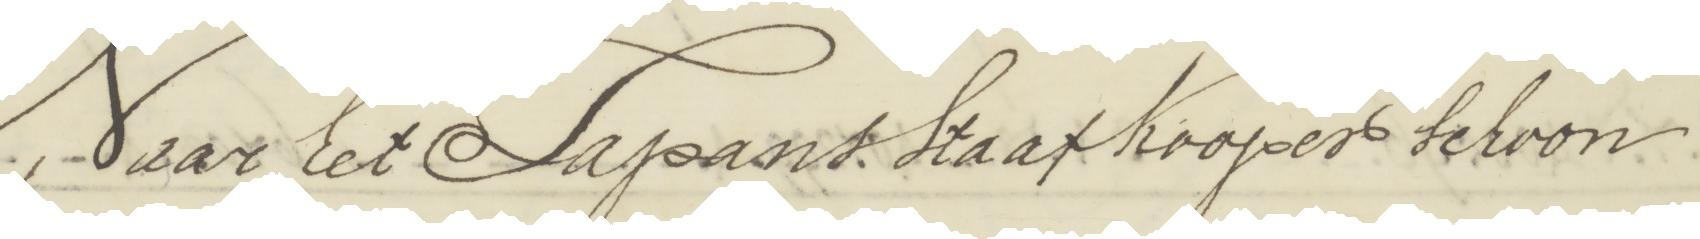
Naar het Iapans Staaf Kooper Schoon
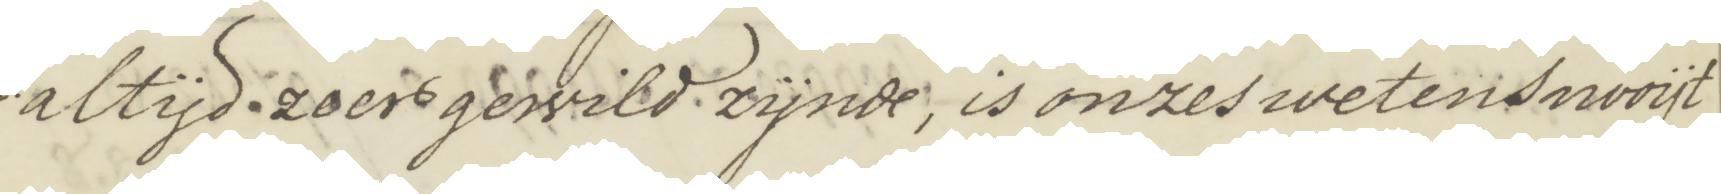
altijd zeer gewild zijnde, is onzes wetens nooijt
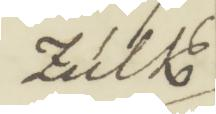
Zulk
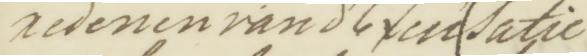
redenen van d’ Excusatie
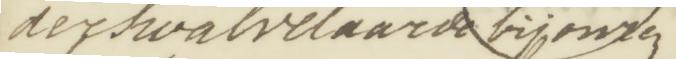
der Swalvelaarde bij onzen
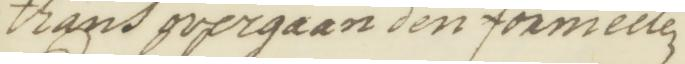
thans overgaan den formeelen
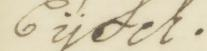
Eijsch.
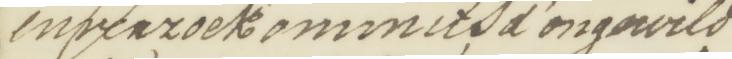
en verzoek ommits d'ongewild
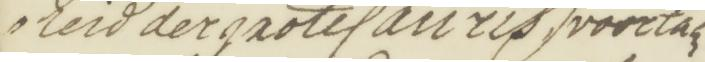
„heid der grote Cauris, voortaan
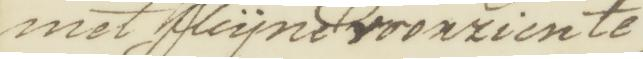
met Kleijne voorzien te
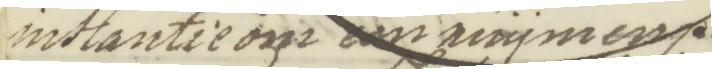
instantie om een ruijmen
